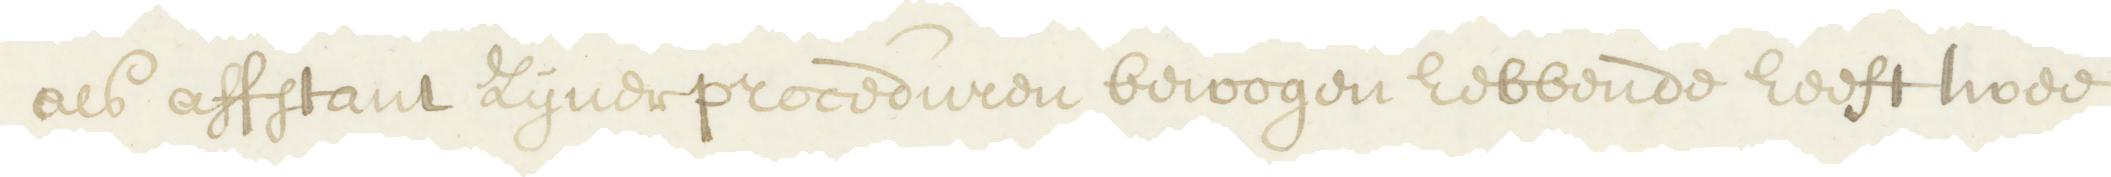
als affstant zijner proceduren bewogen hebbende heeft twee
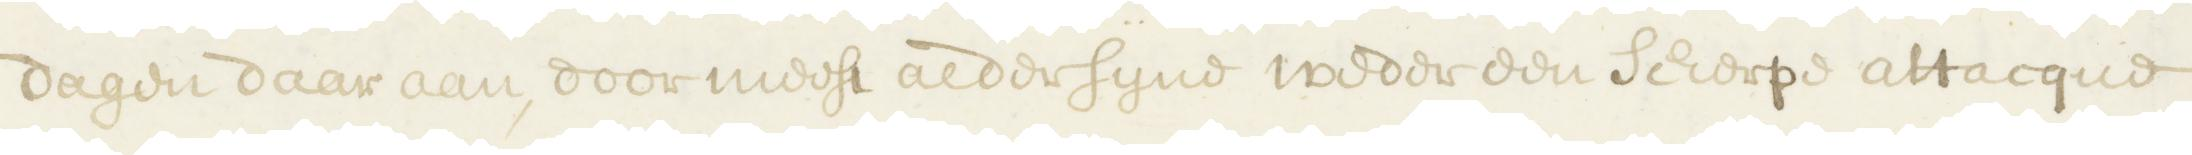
dagen daar aan, door meest alder sijne weder een scherpe attacque
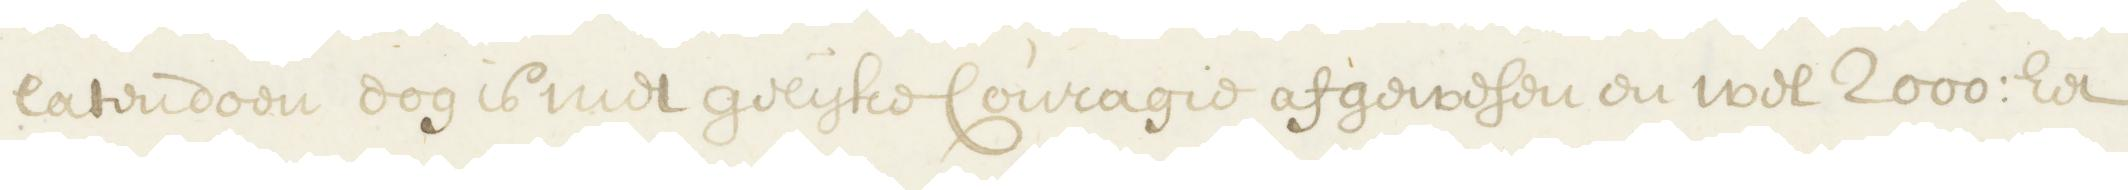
laten doen dog is met gelijke Couragie afgewesen en wel 2000: het
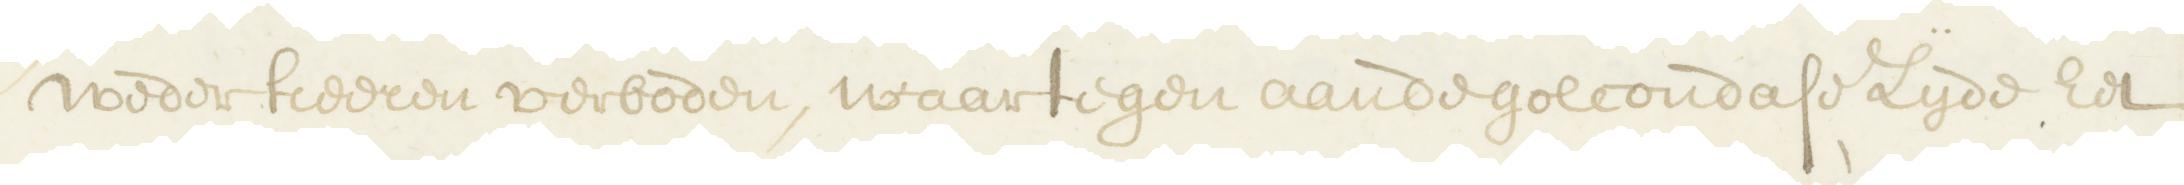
weder keeren verboden, waartegen aan de golcondase zijde het
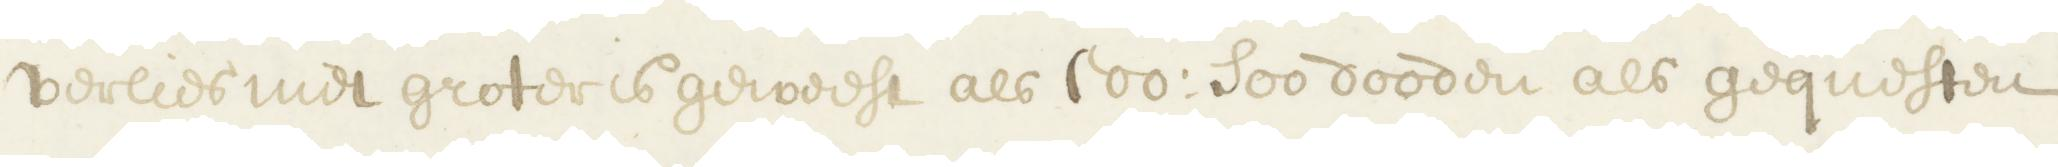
verlies niet groter is geweest als 500: soo dooden als gequesten
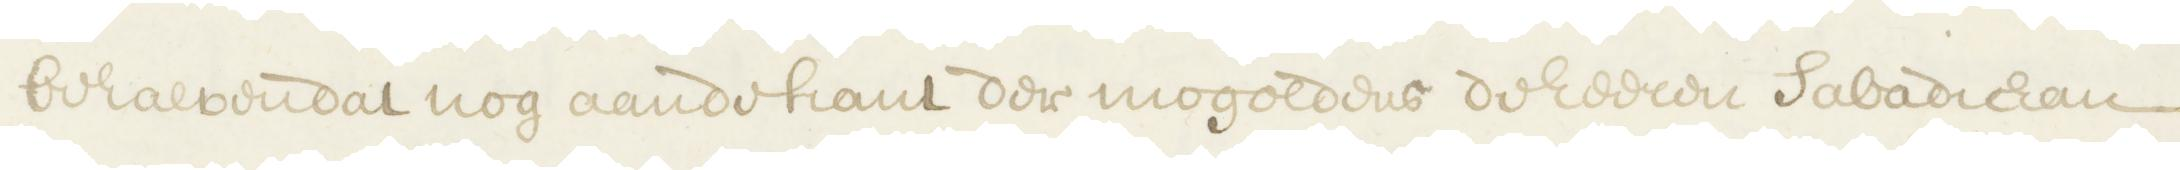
behalven dat nog aan de kant der mogolders de heeren Sabadichan
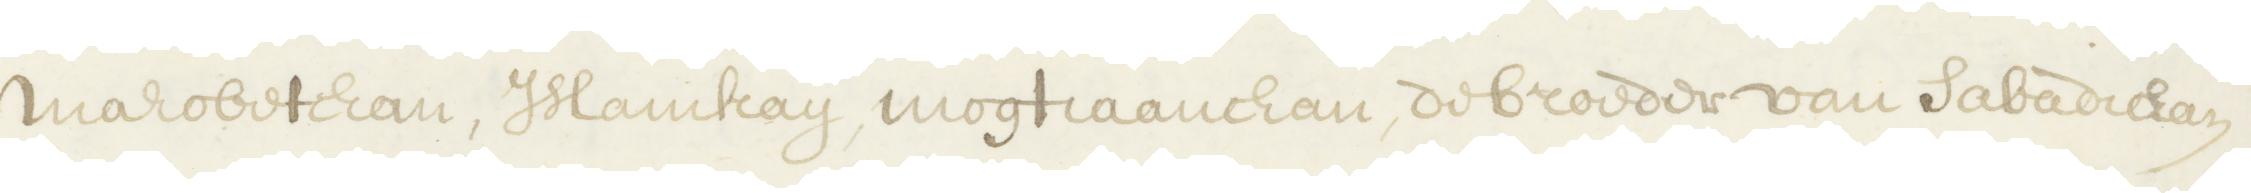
mahobetchan, Islamkaij, mogtiaanchan, de broeder van Sabadichan
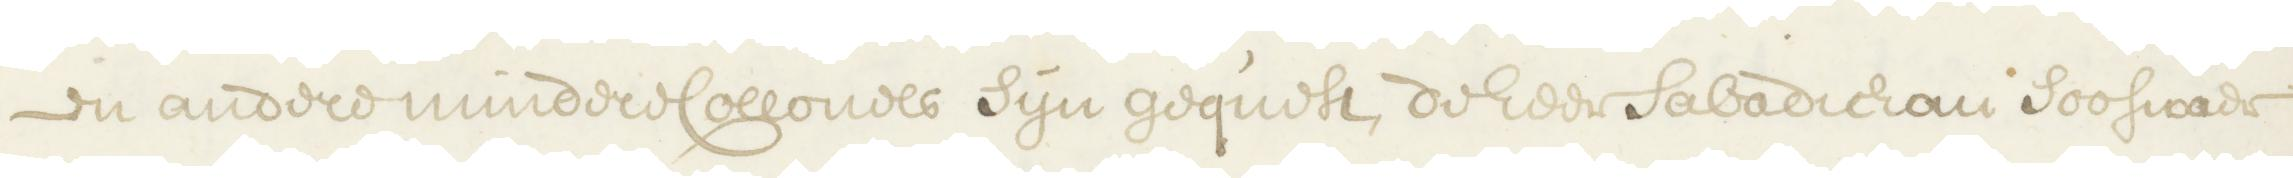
en andere mindere Collonels sijn gequest, de heer Sabadichan sooswaer
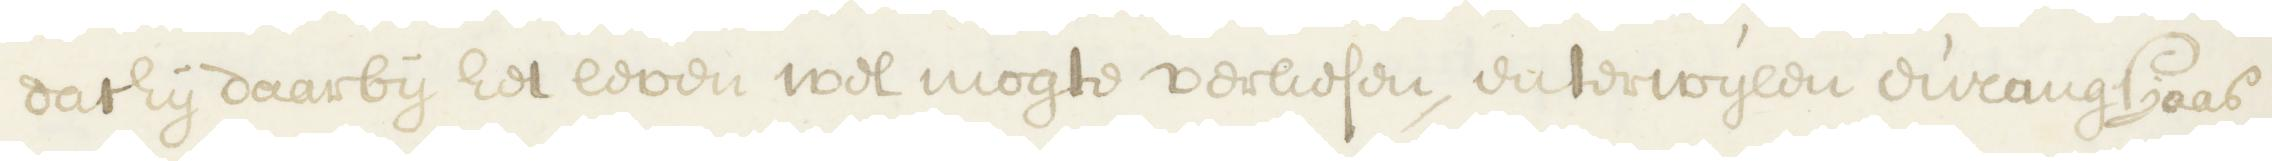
dat hij daarbij het leven wel mogte verliesen, en terwijlen eurangsjaas
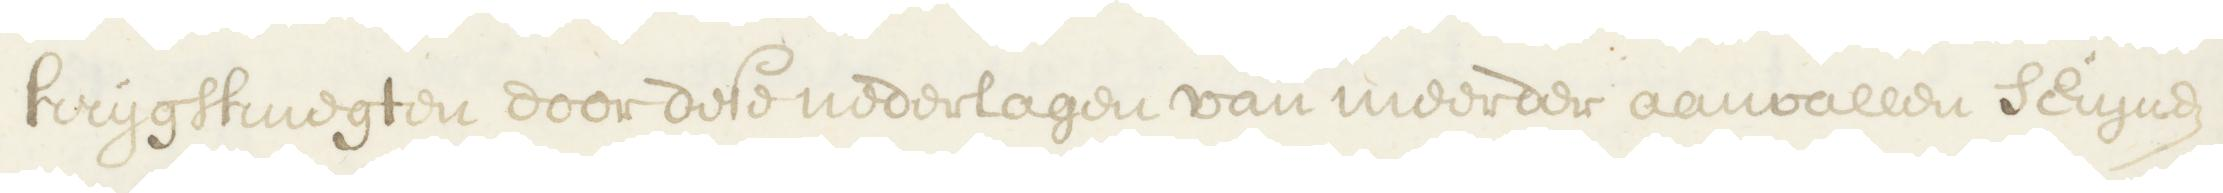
krijgsknegten door dese nederlagen van meerder aanvallen schijnen
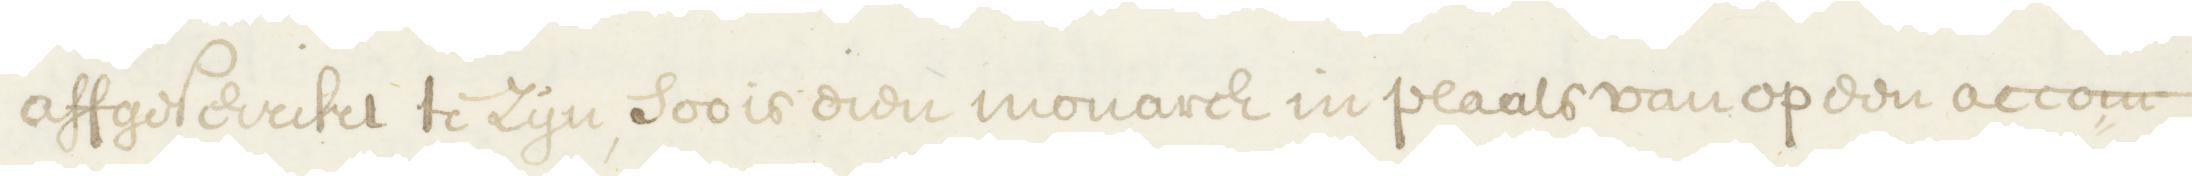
affgeschrikt te zijn, soo is dien monarch in plaats van op een accom
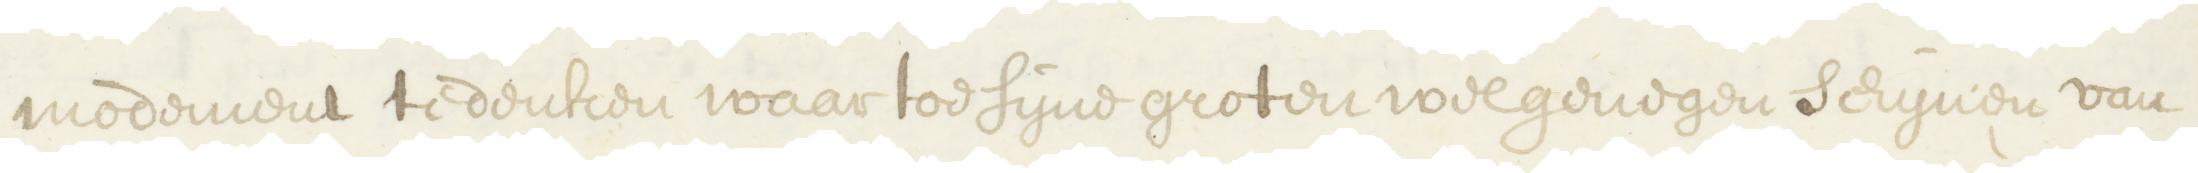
modement te denken waar toe sijne groten wel genegen schijnen van
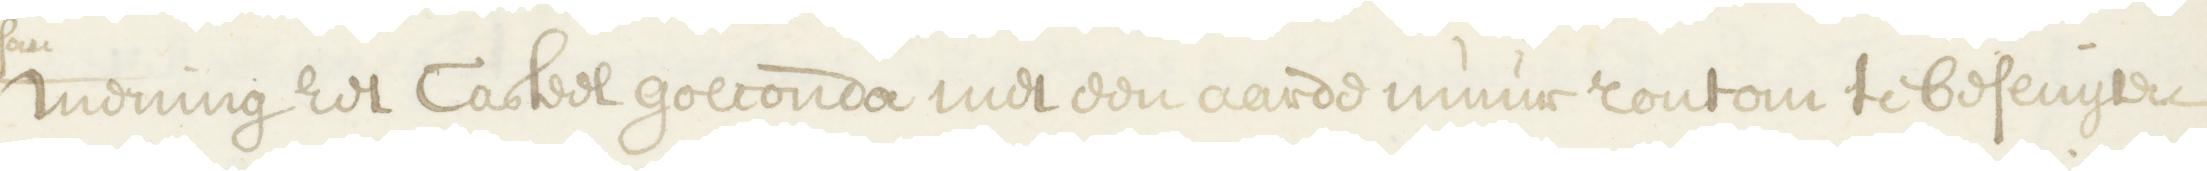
mening het Casteel golconda met een aarde muur rontom te besluijten
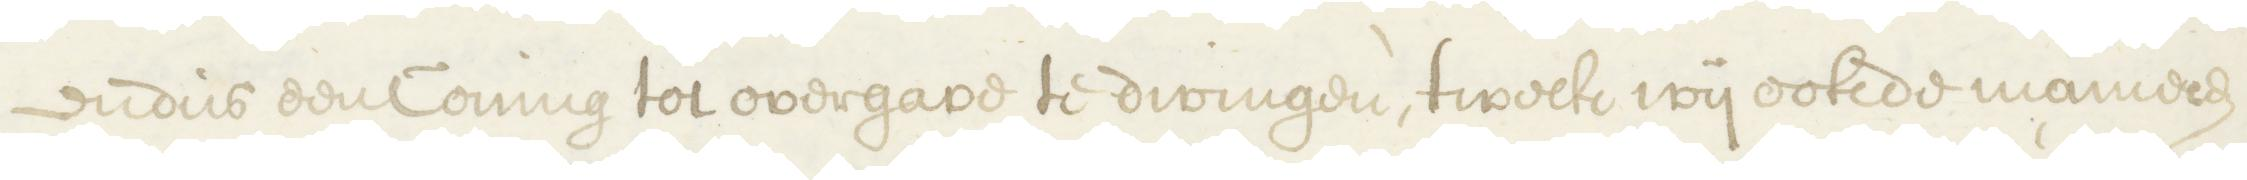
en dus den Coning tot overgave te dwingen, 't welk wij ook de manieren
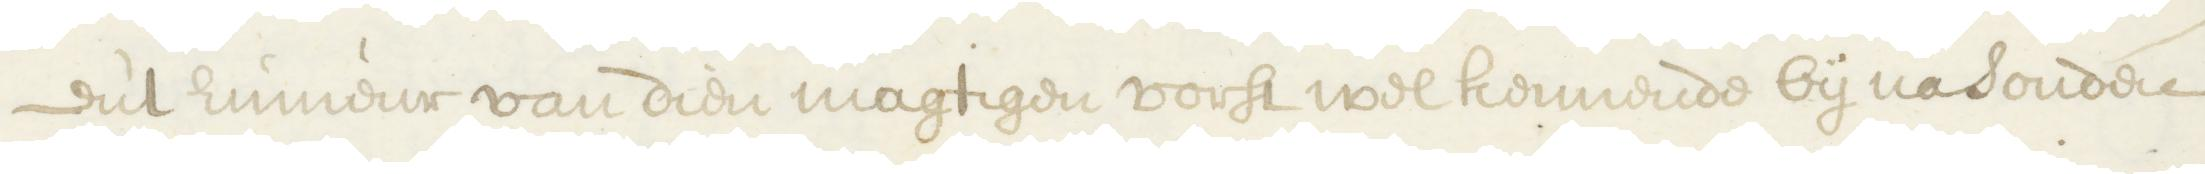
en 't humeur van dien magtigen vorst wel kennende bij na souden
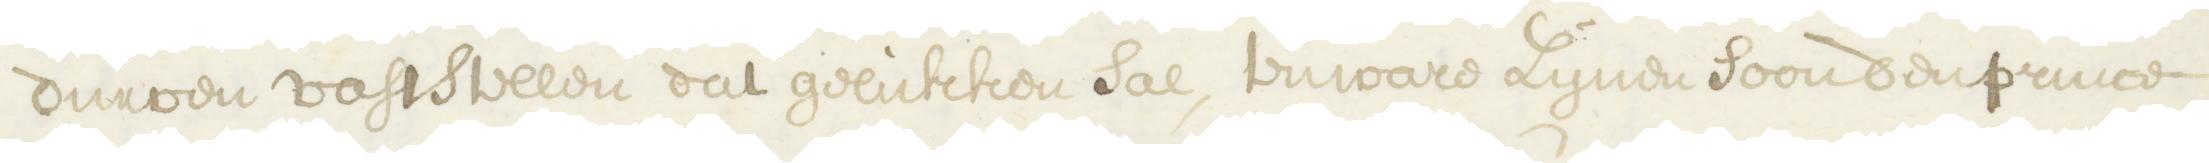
durven vaststellen dat gelukken sal, ten ware zijnen soon den prince
